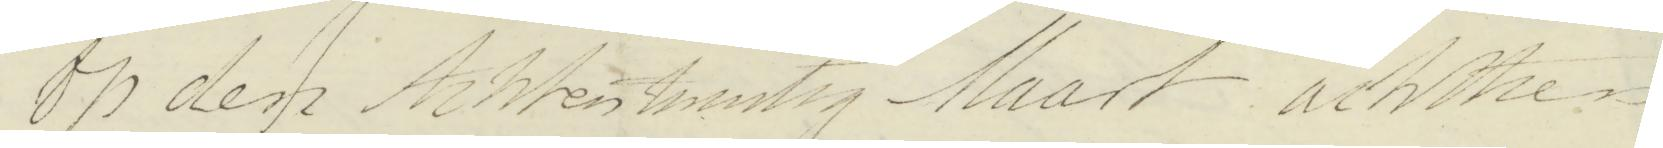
Op den Achtentwintig Maart achttien
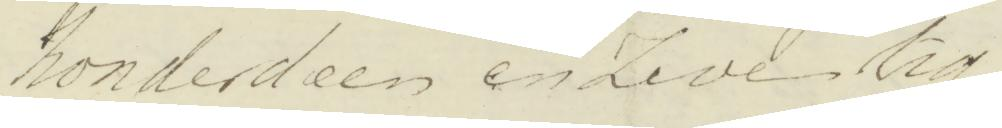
honderd een en Zeventig
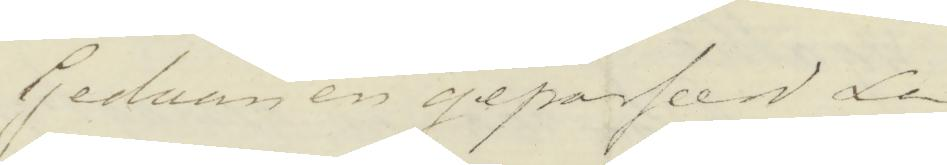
Gedaan en gepasseerd &
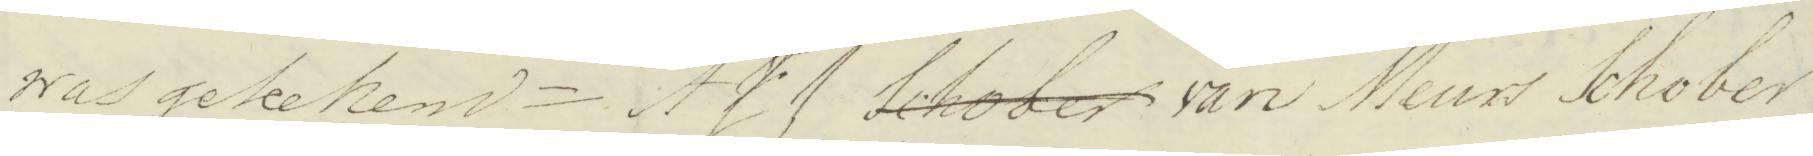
was geteekend= A J C Schober van Meurs Schober
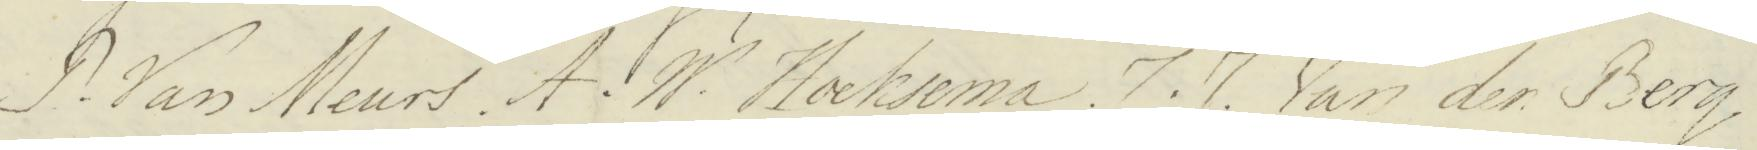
P: Van Meurs A: W: Hoeksema J. J. Van den Berg
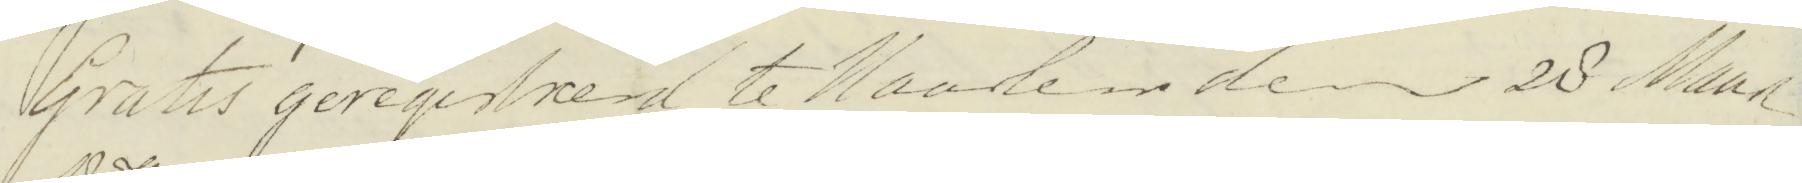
Gratis geregistreerd te Haarlem den 28 Maart
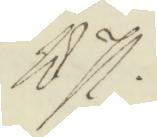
1871.
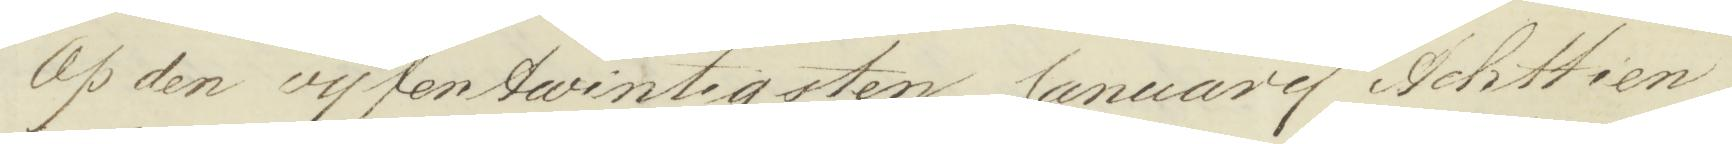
Op den vijfentwintigsten Januarij Achttien
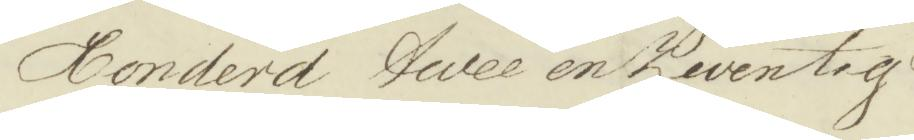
Honderd Twee en Zeventig
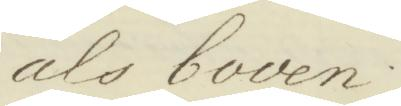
als boven
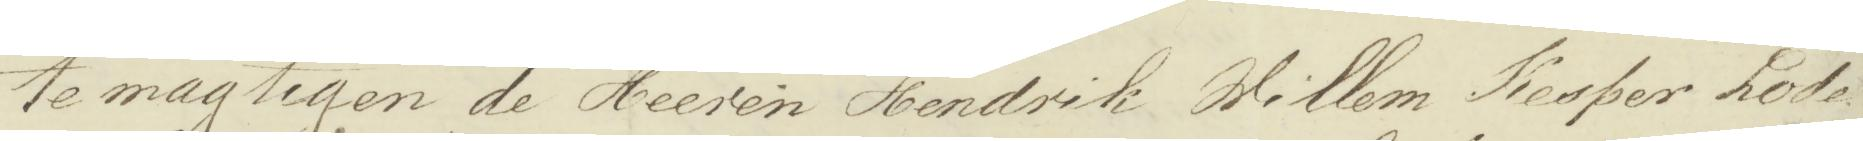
te magtigen de Heeren Hendrik Willem Kesper Lode
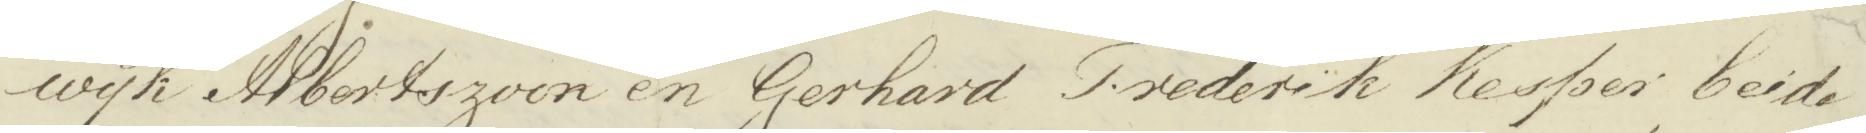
wijk Albertszoon en Gerhard Frederik Kesper beide
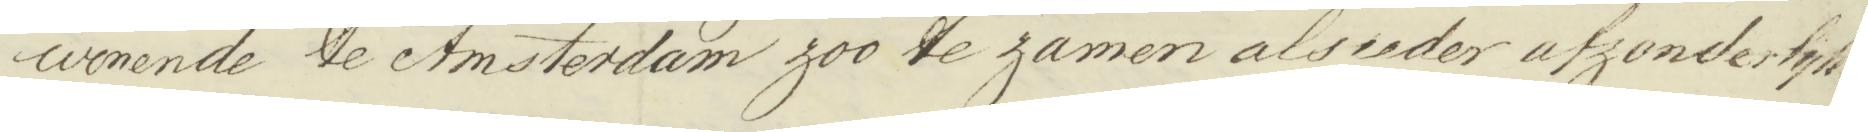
wonende te Amsterdam zoo te zamen als ieder afzonderlijk
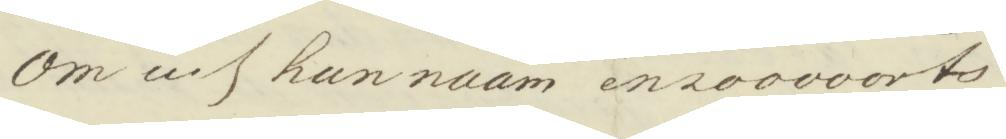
om uit hun naam enzoovoorts
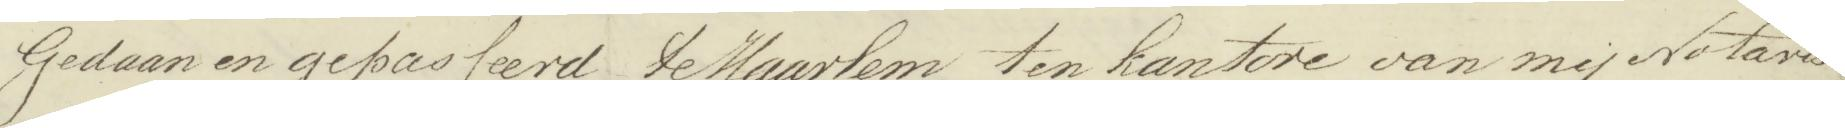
Gedaan en gepasseerd te Haarlem ten kantore van mij Notaris
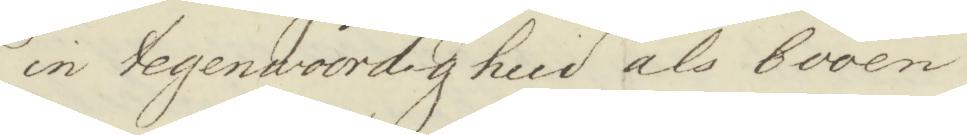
in tegenwoordigheid als boven
